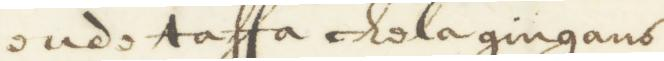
ende taffa chela gingans
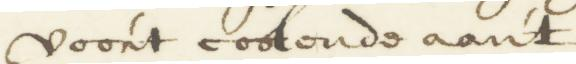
voor’t costende aan’t
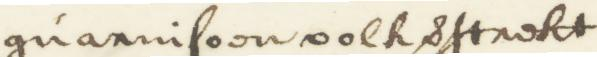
guarnisoen volk verstrekt
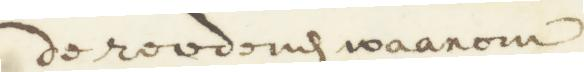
de reedenen waarom
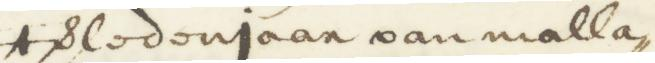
t verledenjaar van malla„
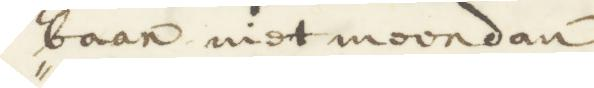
„baar niet meerdan
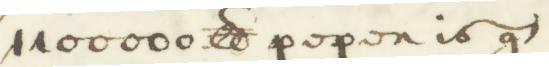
1100000 lb peper is g'
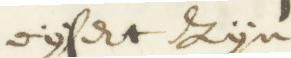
eijscht zijn
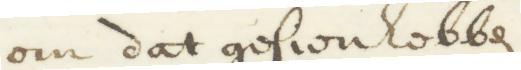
om dat gesien hebben
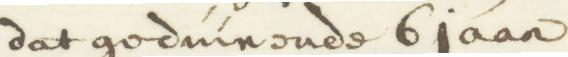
dat geduurende 6 jaar
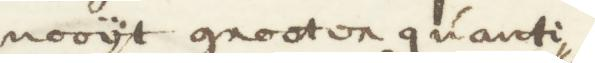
nooijt grooter quanti„
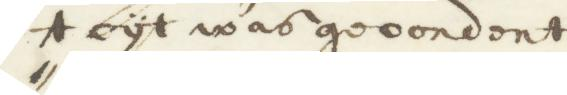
„teijt was gevordert
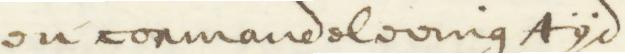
en cormandeleenig tijd
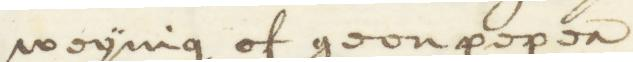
weijnig of geen peper
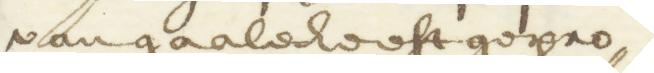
van gaaleheeft gepro„
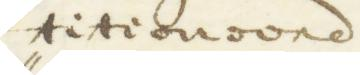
„titioneerd
